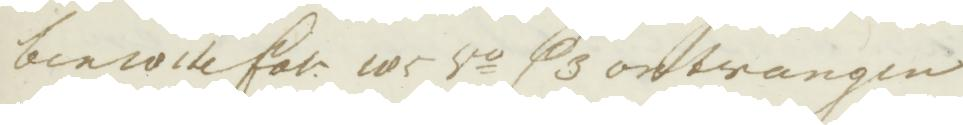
ber 1814 fol. 105 v=o C 3 ontvangen
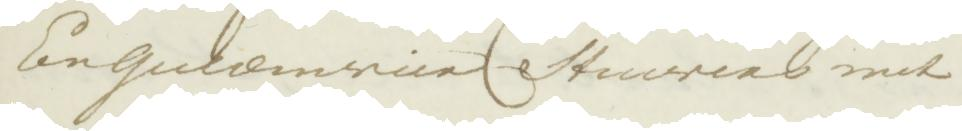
Een gulden vier stuivers met
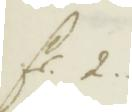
ƒ. 2
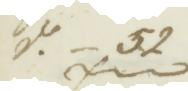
v. — 52
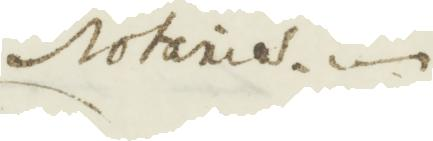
Notaris. —
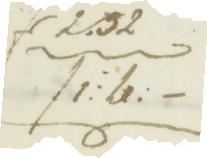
ƒ 2.52 ƒ 1: 4: —
